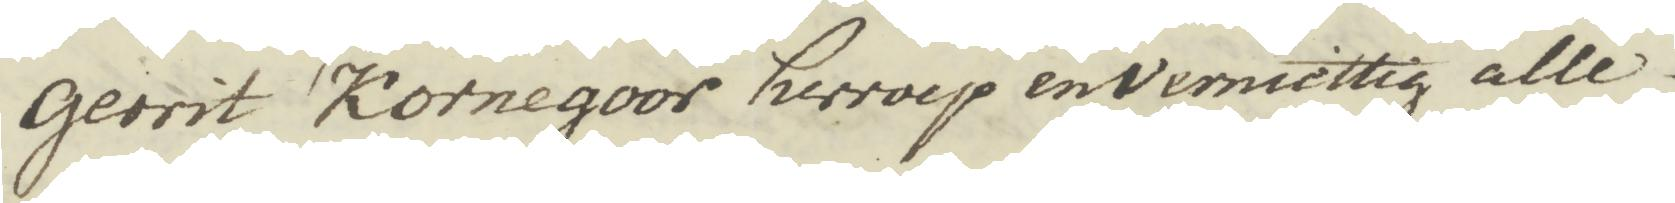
Gerrit Kornegoor herroep en verniettig alle
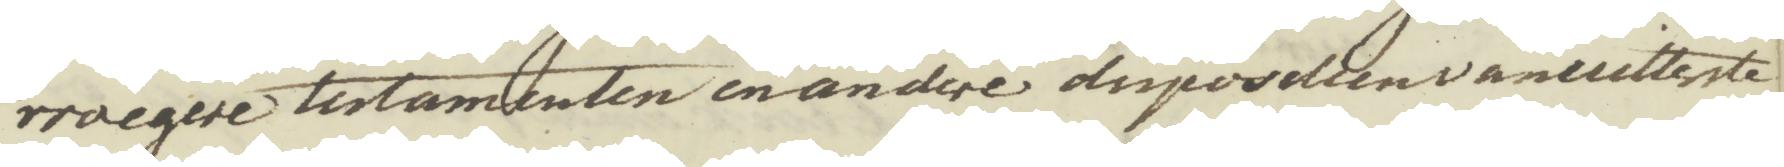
vroegere testamenten en andere dispositien van uitterste
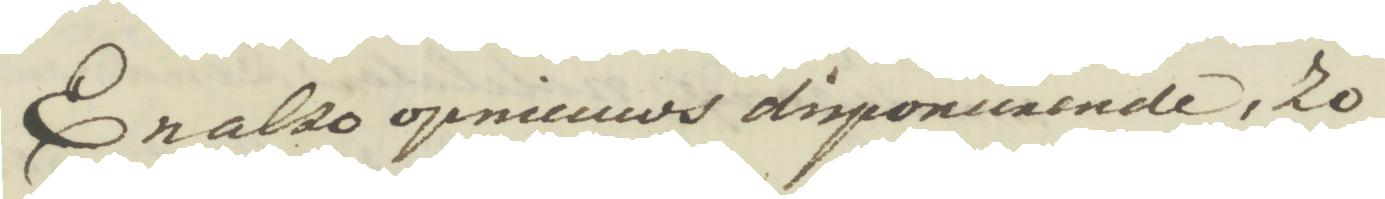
En alzo opnieuws disponeerende, zo
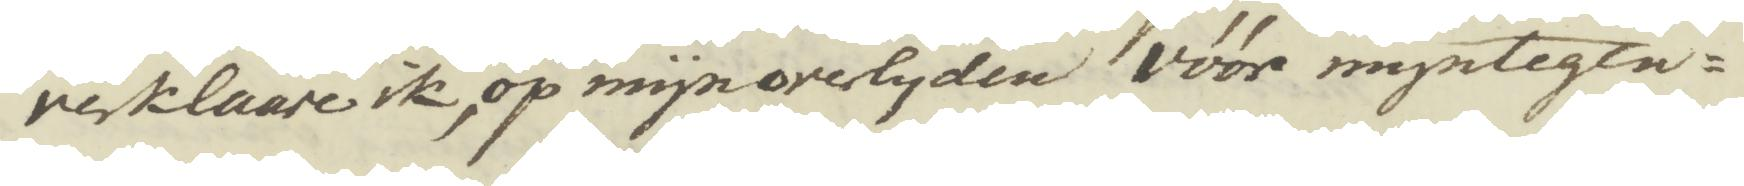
verklaare ik, op mijn overlyden vóór myn tegen=
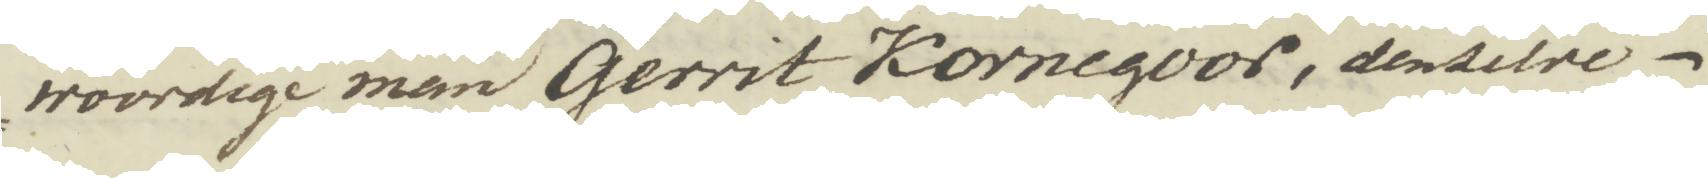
=woordige man Gerrit Kornegoor, denzelve -
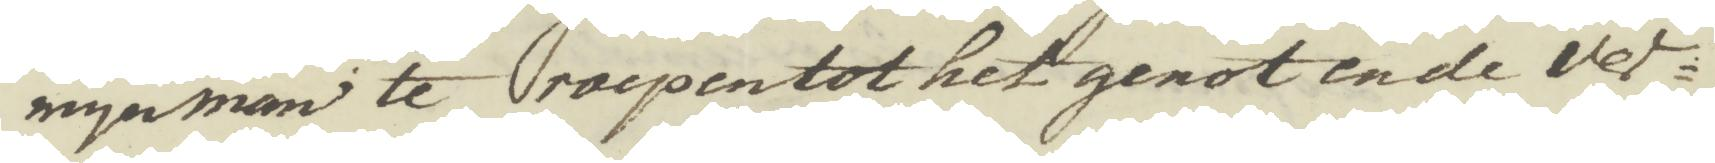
myn man te roepen tot het genot en de ver=
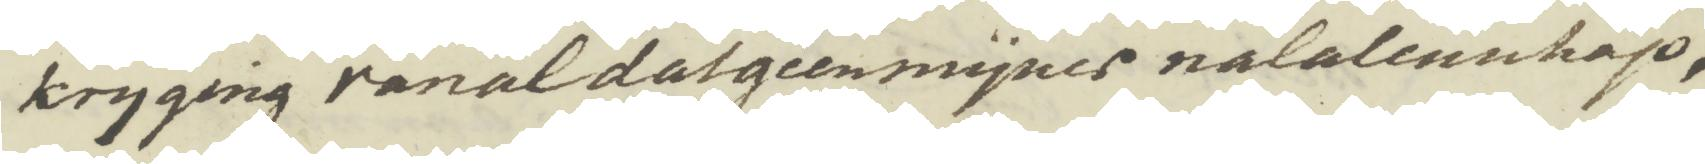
=kryging vanal datgeen mijner nalatenschap,
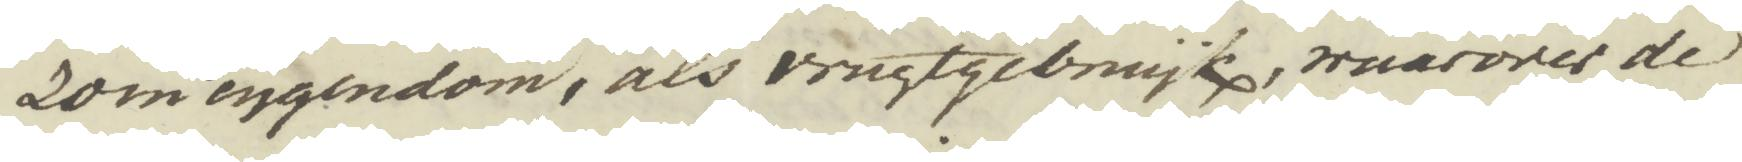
zo in eygendom, als vrugtgebruijk, waarover de
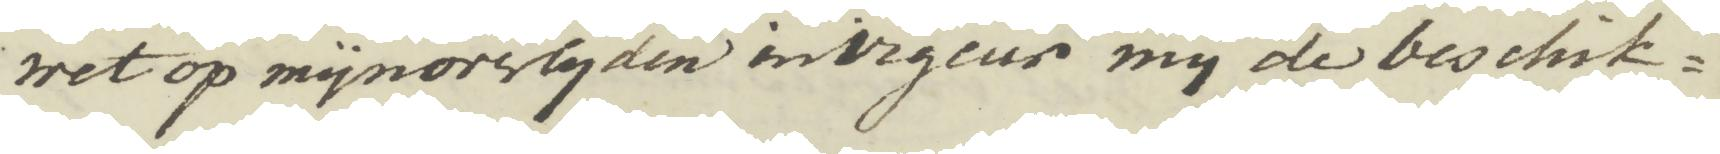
wet op mijn overlyden invigeur mij de beschik=
